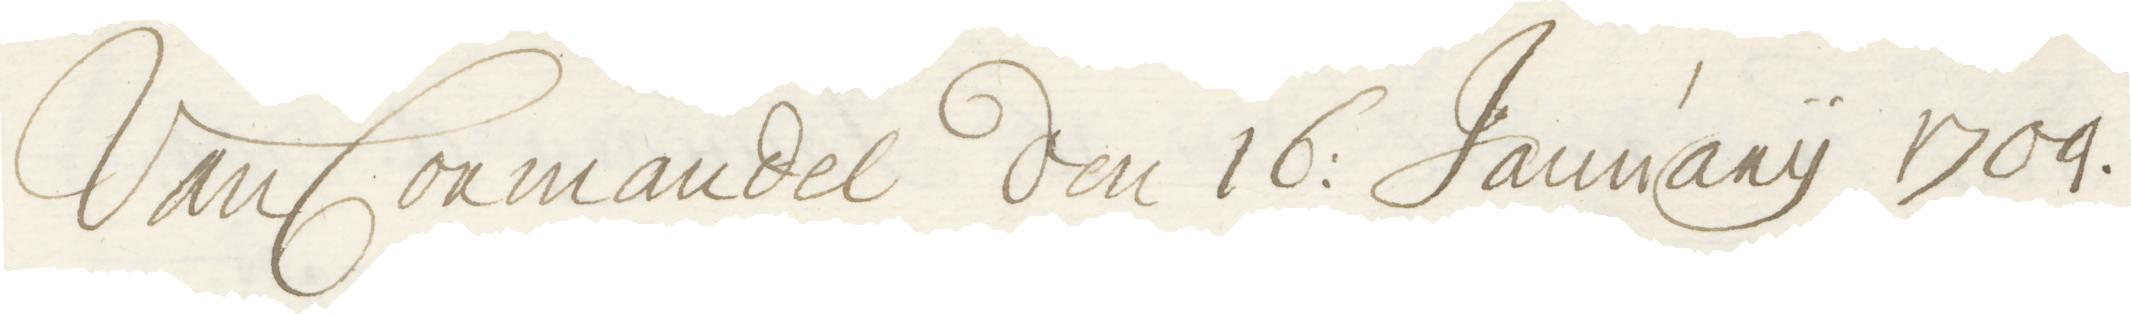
Van Cormandel den 16: Januarij 1704.
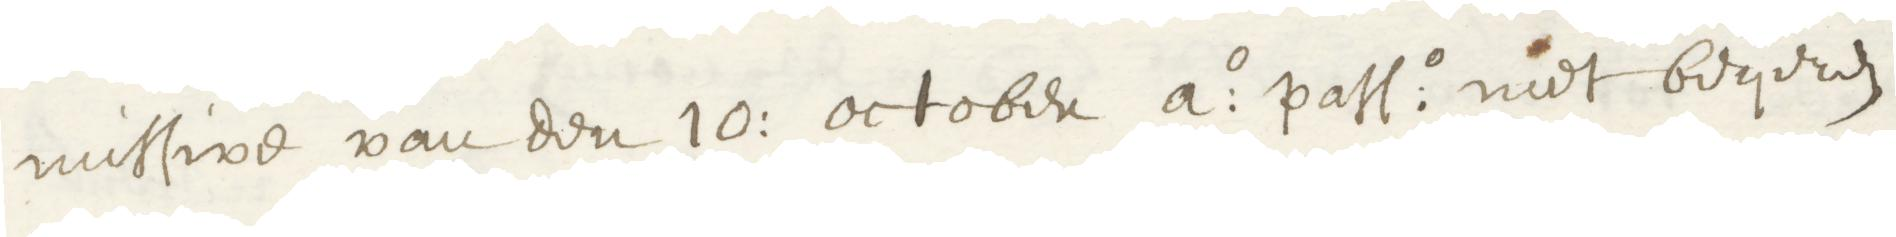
missive van den 10: october a:o pass:o met beijeren
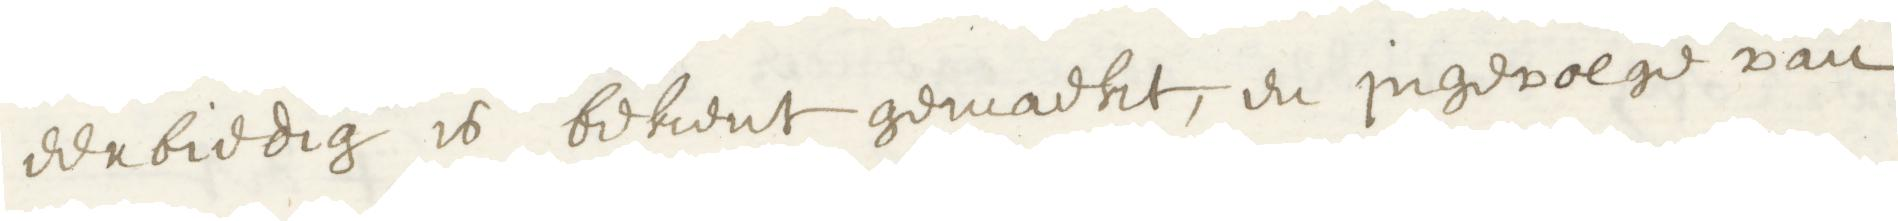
eerbiedig is bekent gemaekt, en ingevolge van
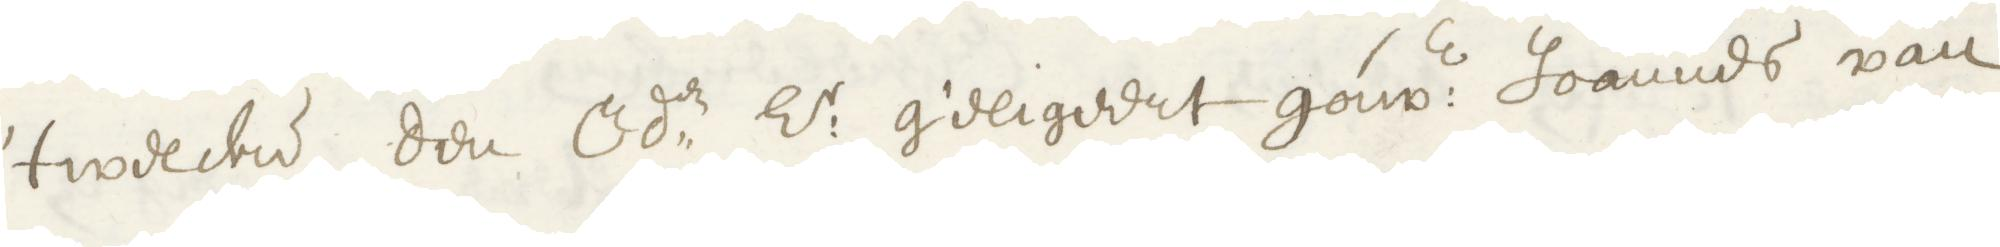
'twelcke den Ed„en h:r g'eligeert gouv:r Ioannes van
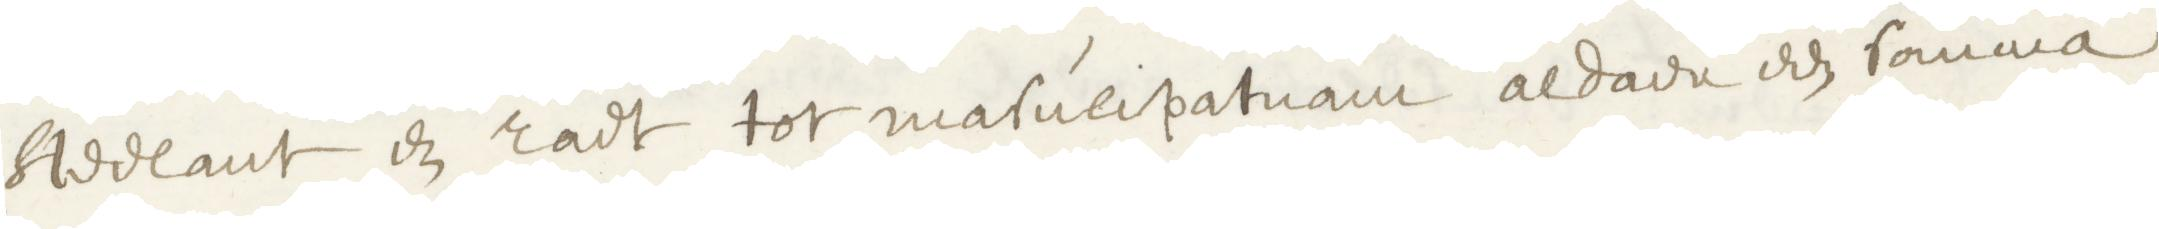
steelant en raet tot masulipatnam aldaer een somma
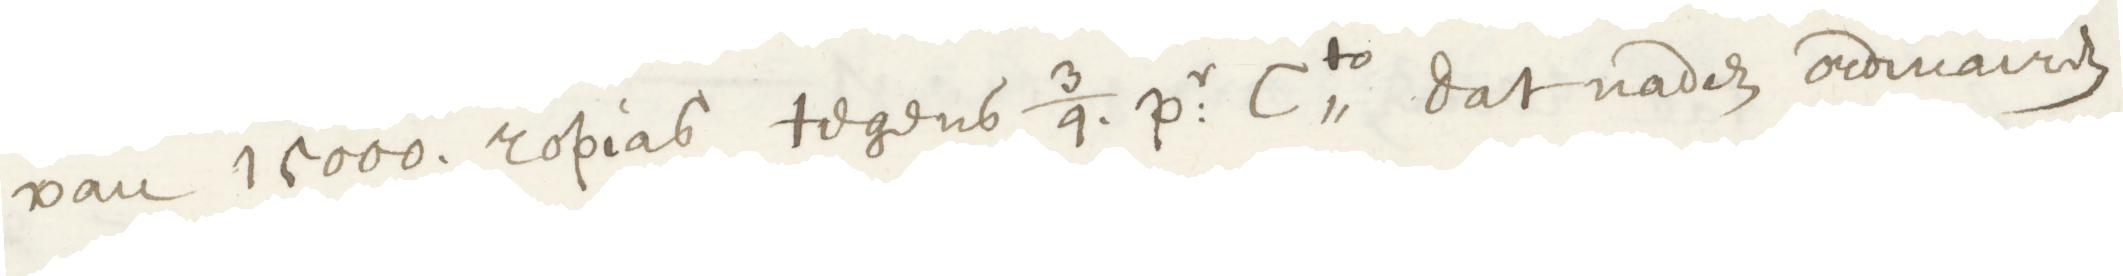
van 15000. ropias tegens ¾. p:r C„to dat naden ordinairen
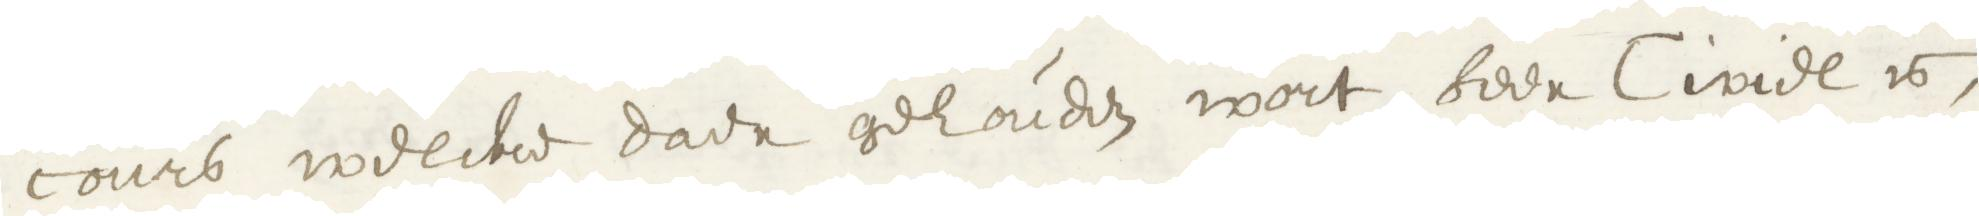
cours welcke daer gehouden wort, seer Civiel is,
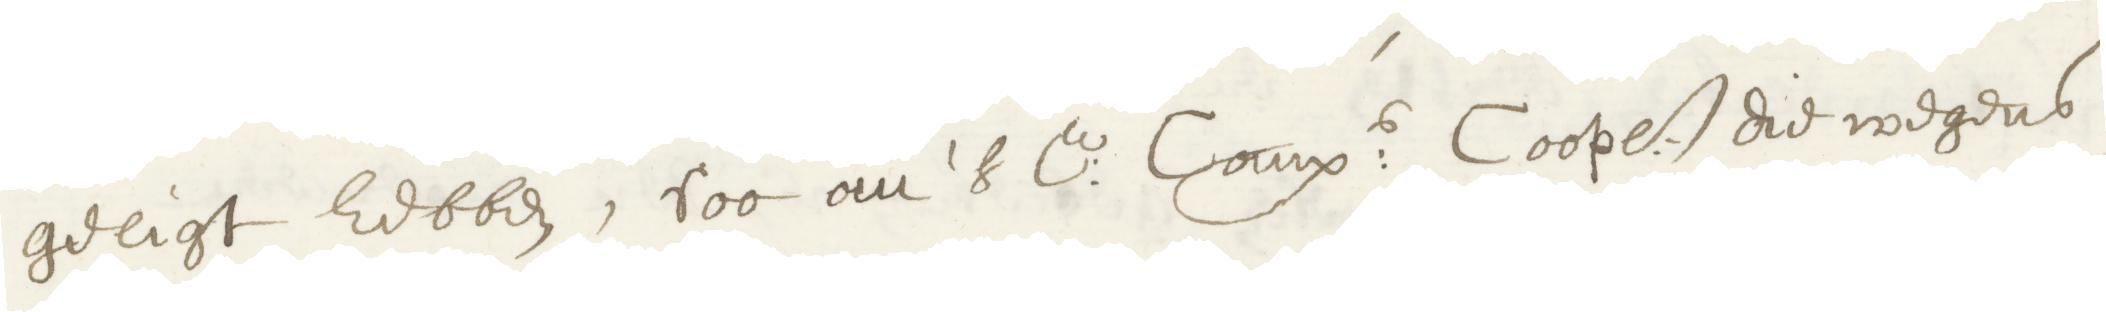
geligt hebben, soo om ’s E: Comp:s Cooplijk die wegens
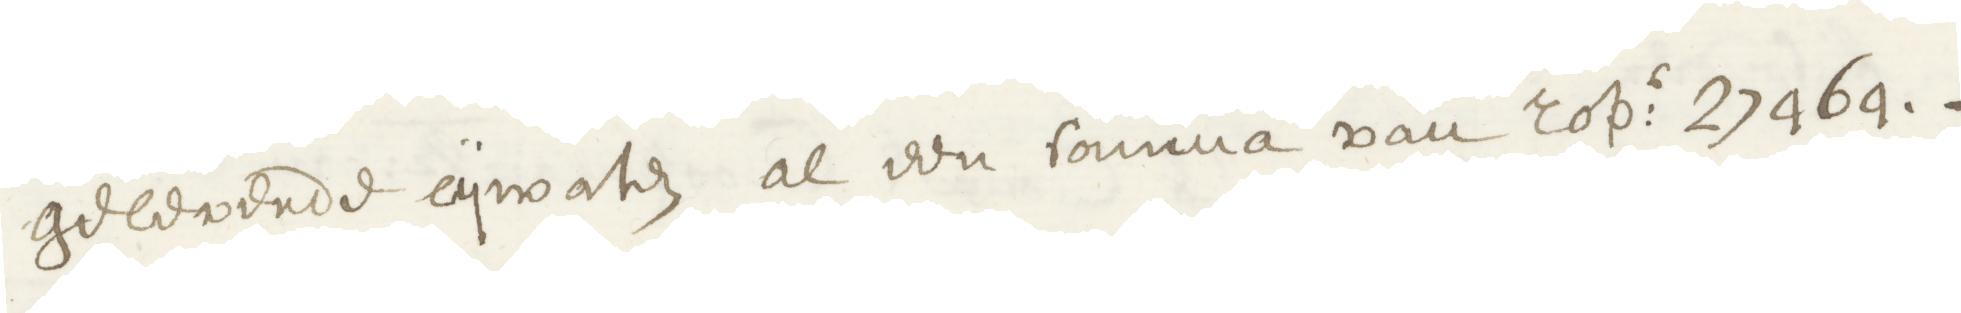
geleverde lijwaten al een somma van rop:s 27464.
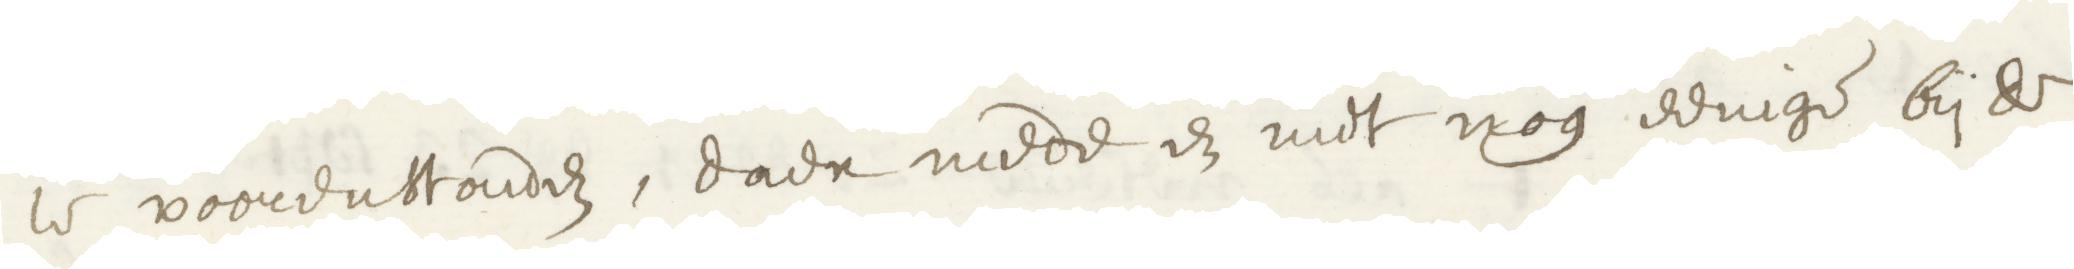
te voorenstonden, daer mede en met nog eenige bij de
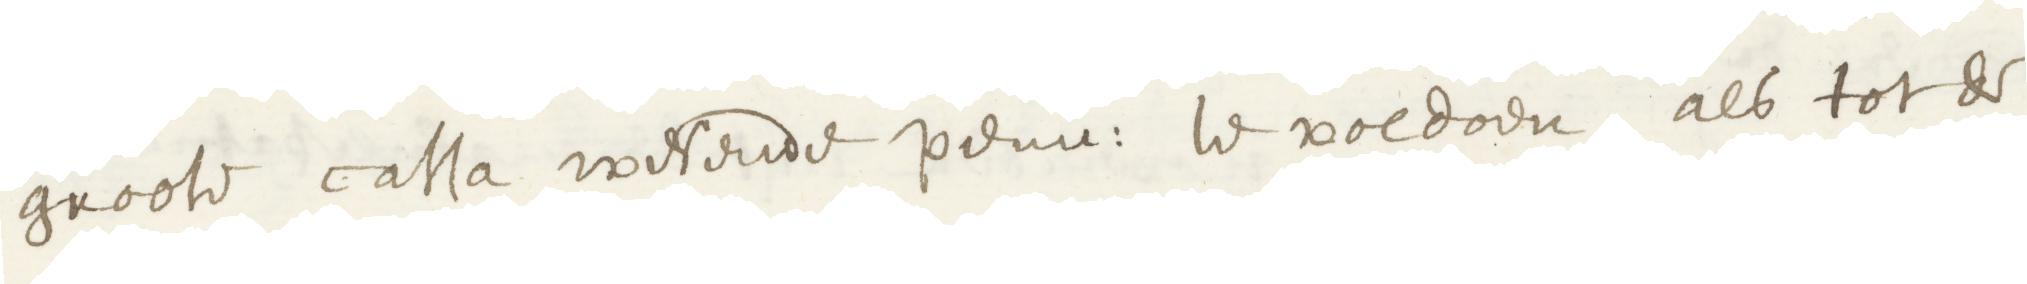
groote cassa wesende penn: te voldoen, als tot de
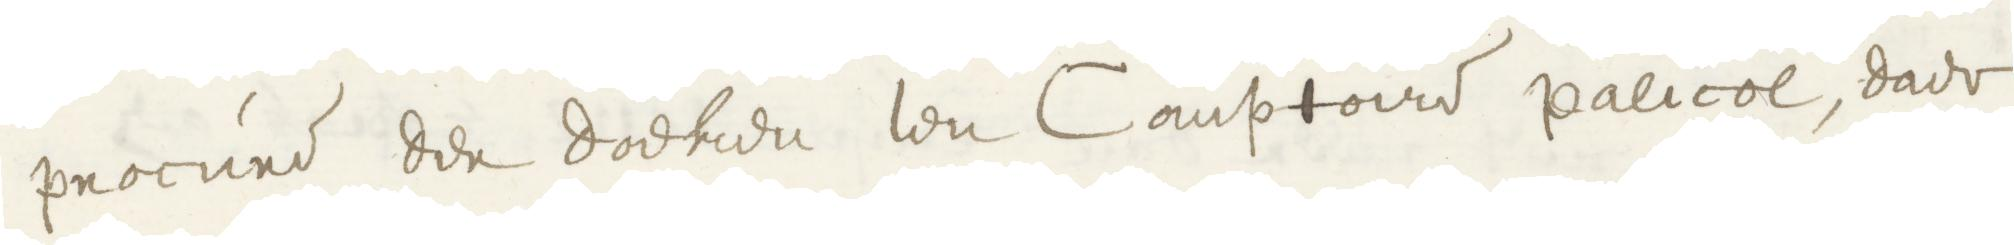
procure der doeken ten Comptoire palicol, daer
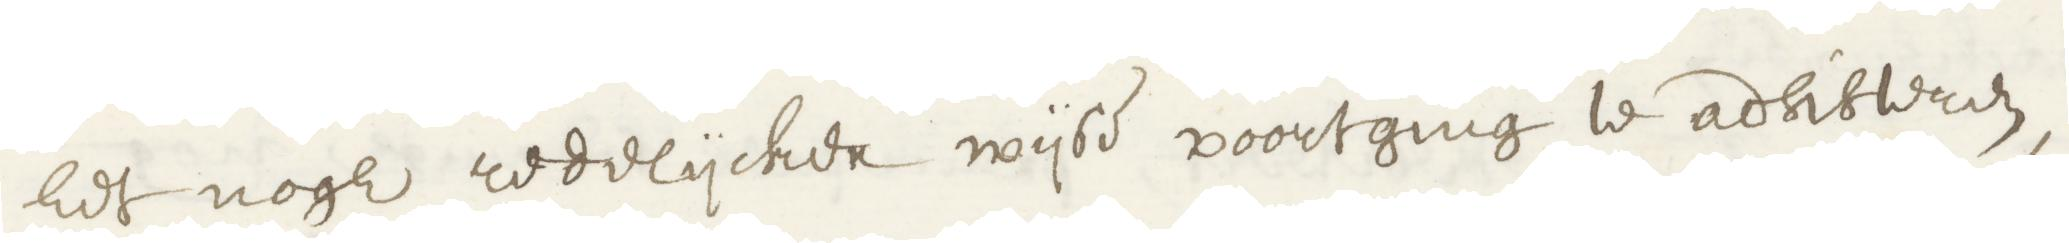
het nogh redelijcker wijse voortging te adsisteren,
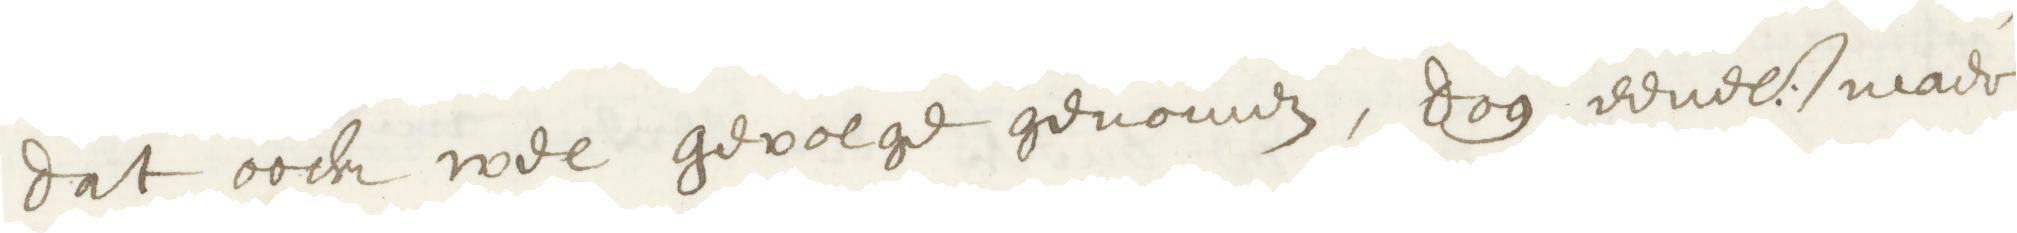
dat oock wel gevolge genomen, dog eenelijk maer
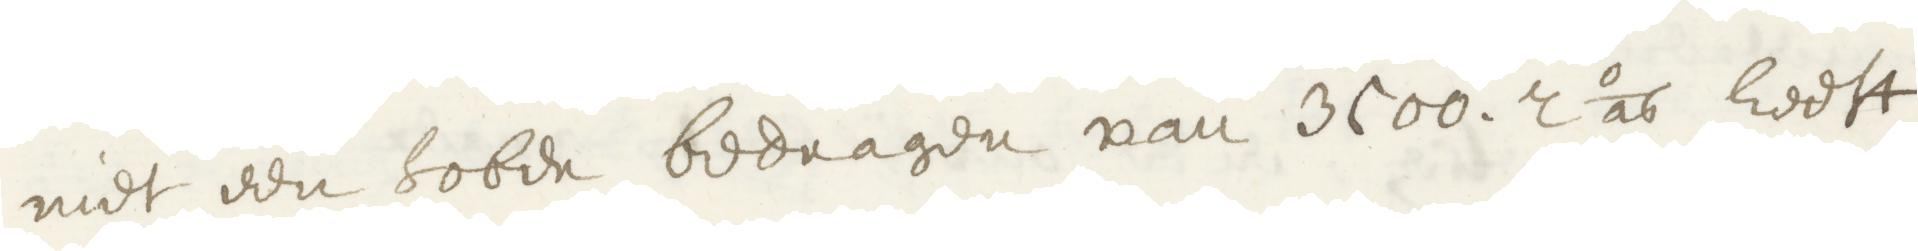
niet een sober bedragen van 3500. r o/as heeft
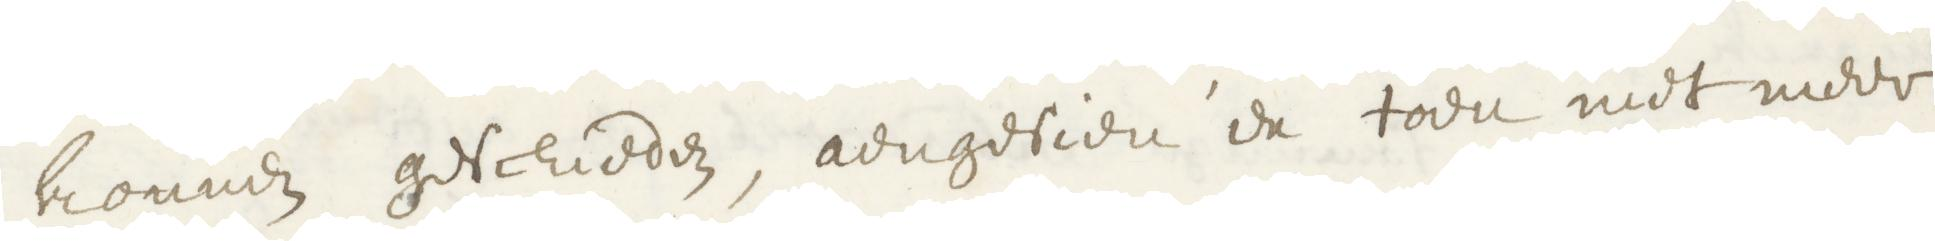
konnen geschieden, aengesien 'er toen niet meer
